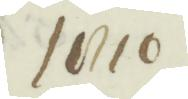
1810
